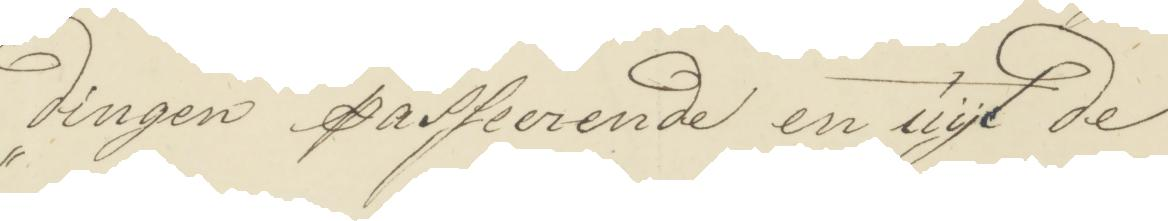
„dingen passeerende en uijt de
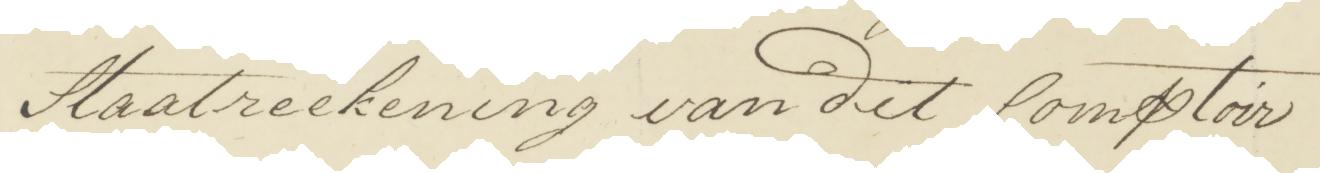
staatreekening van dit Comptoir
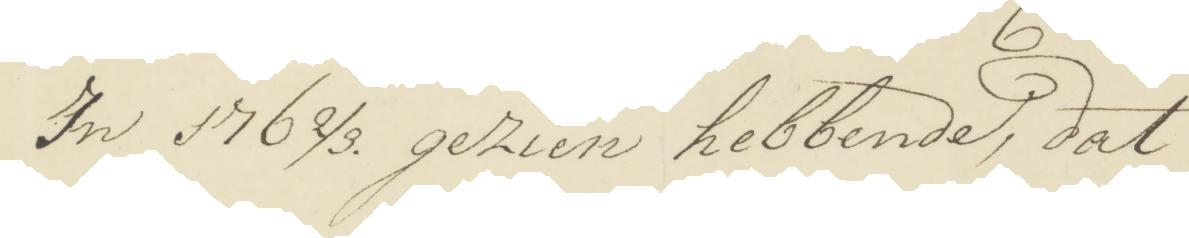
In 176 2/3. gezien hebbende, dat
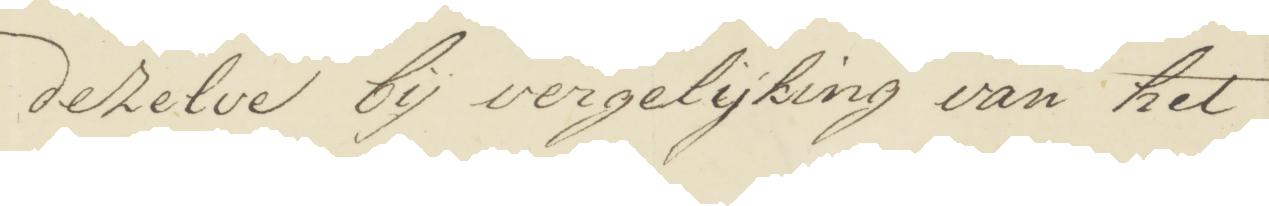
dezelve bij vergelijking van het
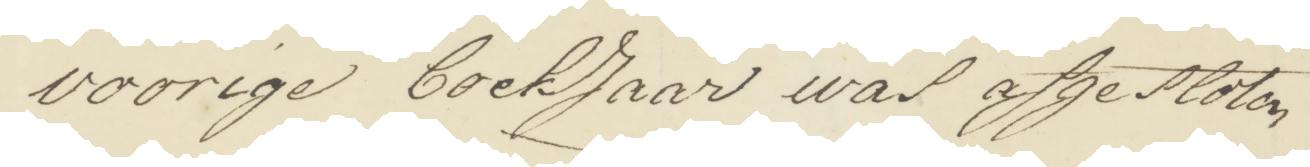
voorige boekJaar was afgesloten
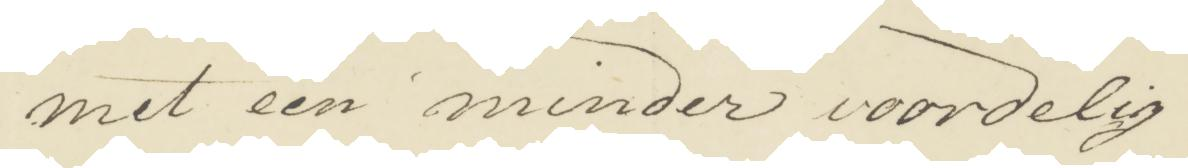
met een minder voordelig
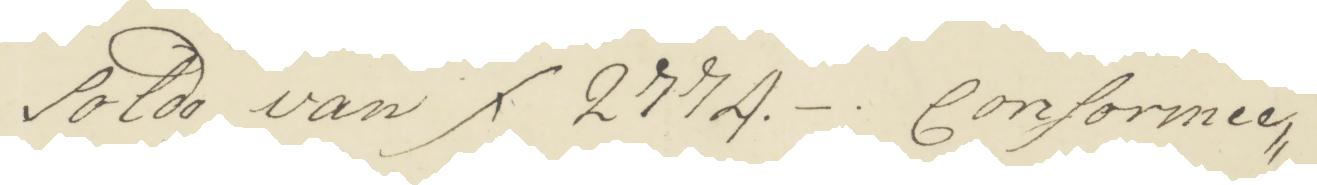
soldo van ƒ 2774. — . Conformee„
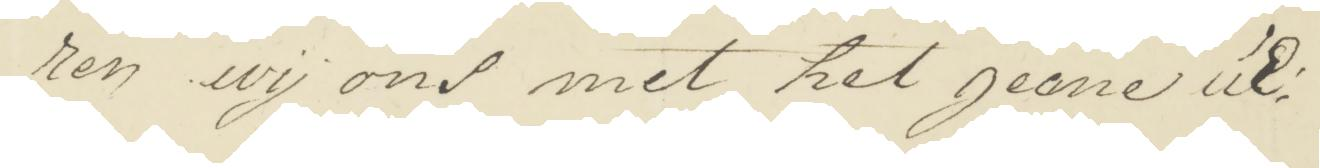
ren wij ons met het geene uE:
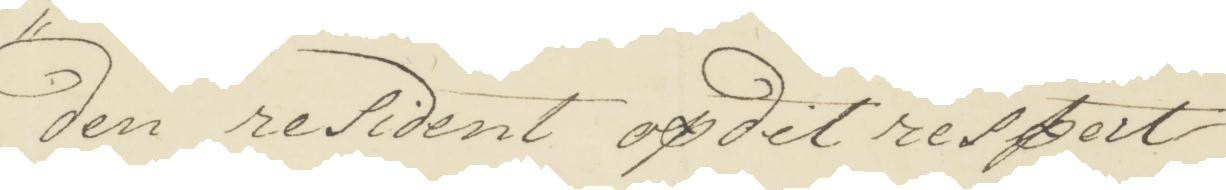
den resident op dit respect
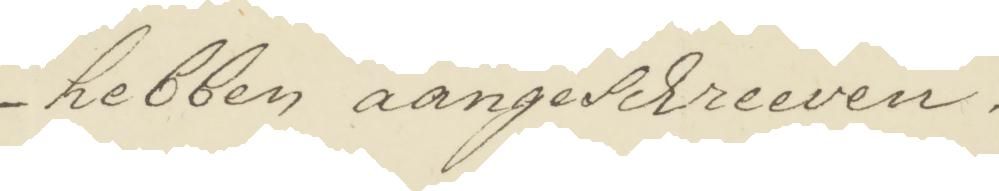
hebben aangeschreeven
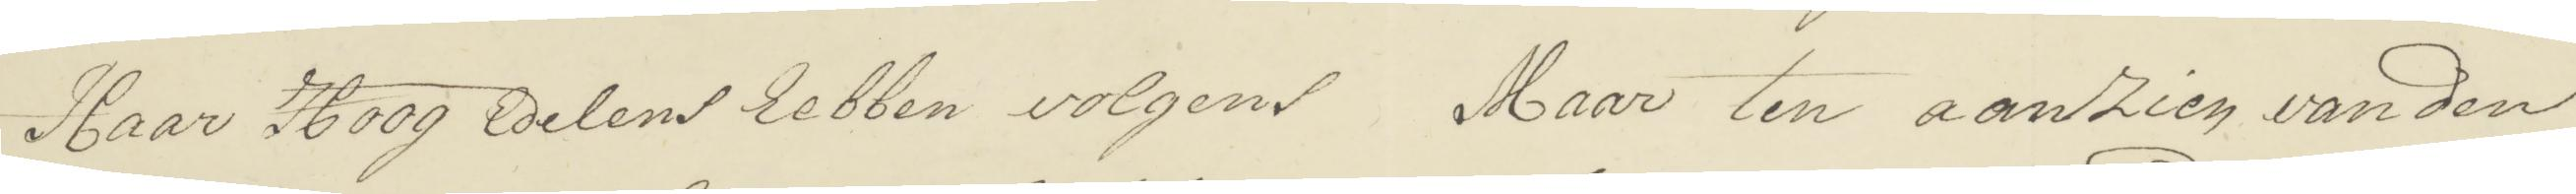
Haar Hoog Edelens hebben volgens Maar ten aanzien van den
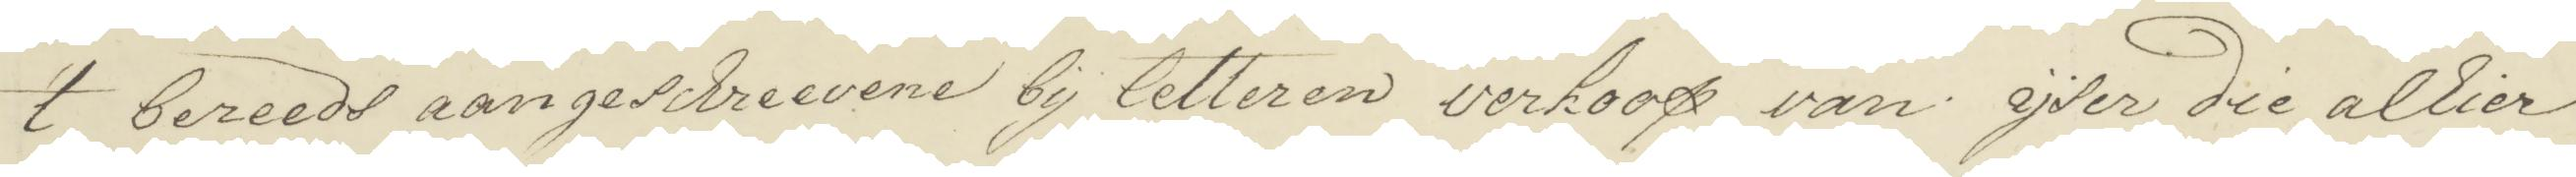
’t bereeds aangeschreevene bij letteren verkoop van ijser die alhier
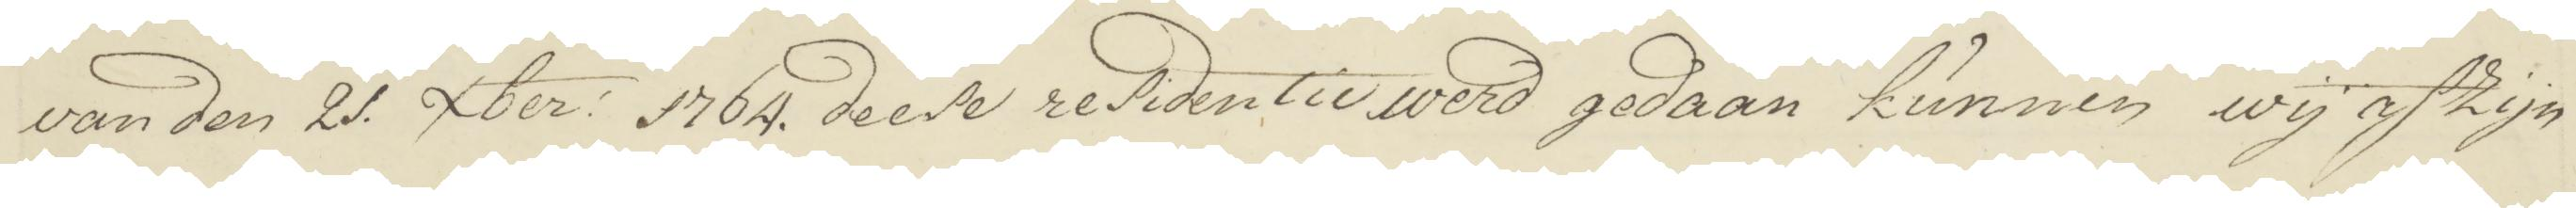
van den 21. xber: 1764. deese residentie werd gedaan kunnen wij af zijn
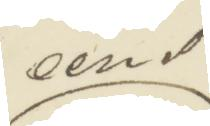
eens
